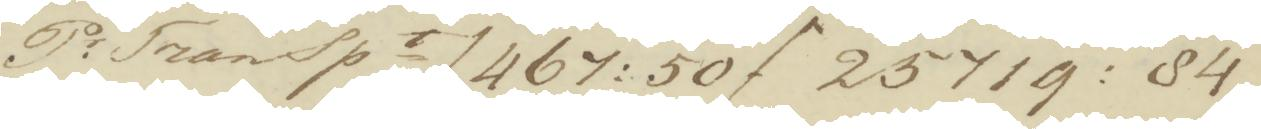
P.r Transp=t ƒ 467: 50 ƒ 25719 : 84
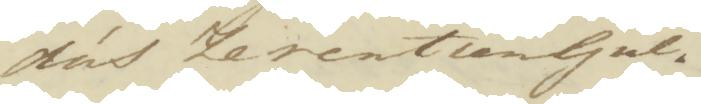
dus zeventien Gul„
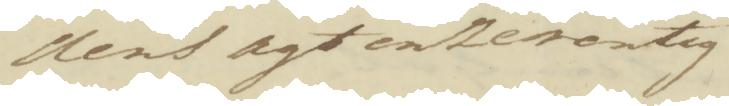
dens agtenzeventig
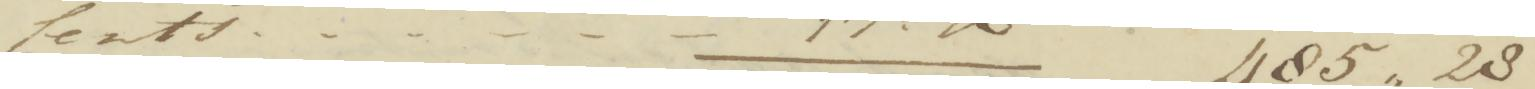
Cents. 17: 78 485 „ 28
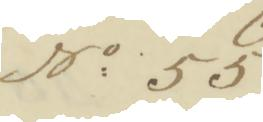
N:o 55
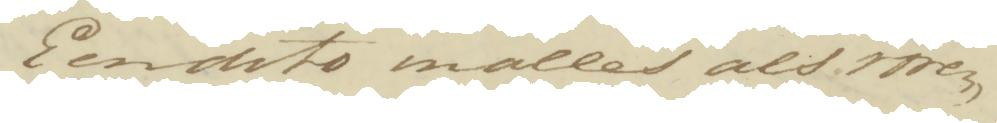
Een dito inalles als voren,
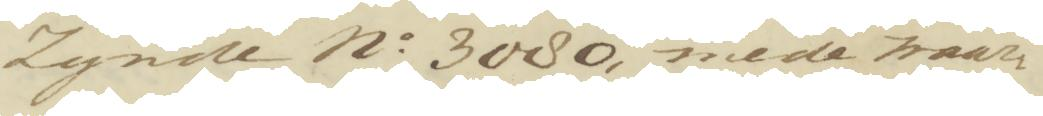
Zynde n.o 3080, mede waar
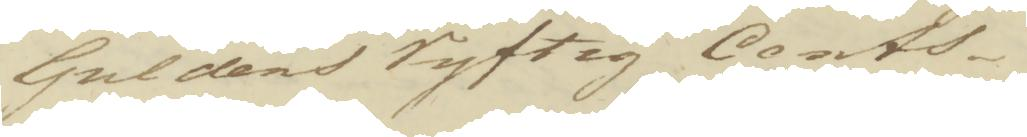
Guldens Vijftig Cents-
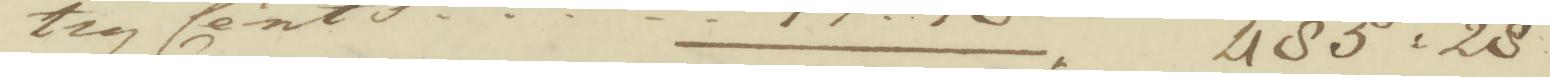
tig Cents 17: 78„ 485 : 28
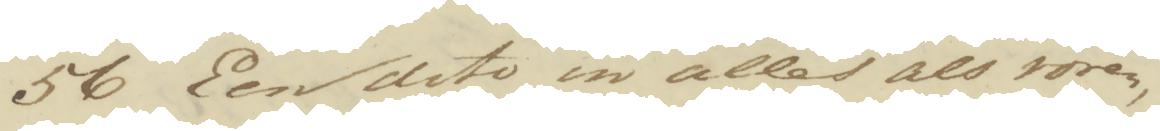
56 Een dito in alles als voren,
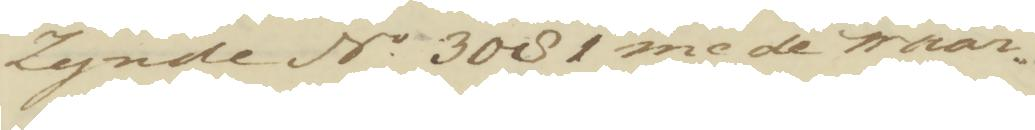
Zynde N.o 3081 mede waar„
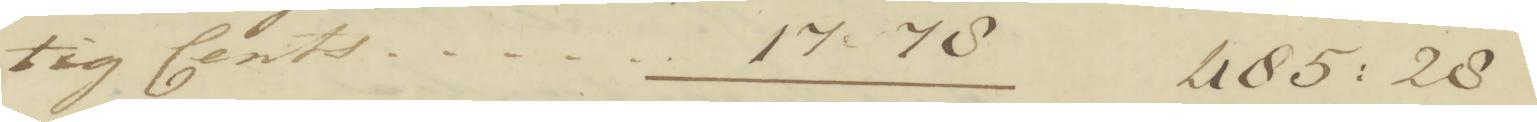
tig Cents 17: 78 485: 28
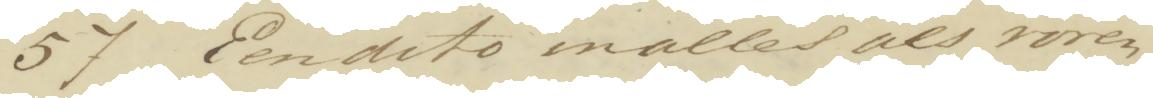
57 Een dito inalles als voren,
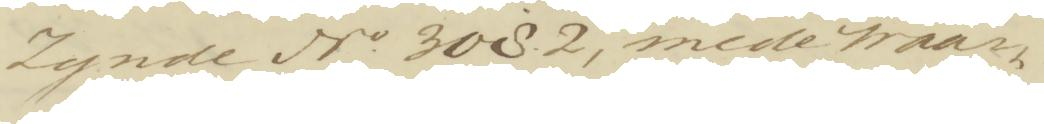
Zynde N:o: 3082, mede waar„
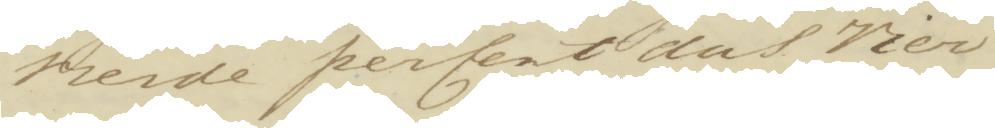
vierde percent dus Vier
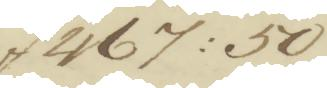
ƒ467 : 50
